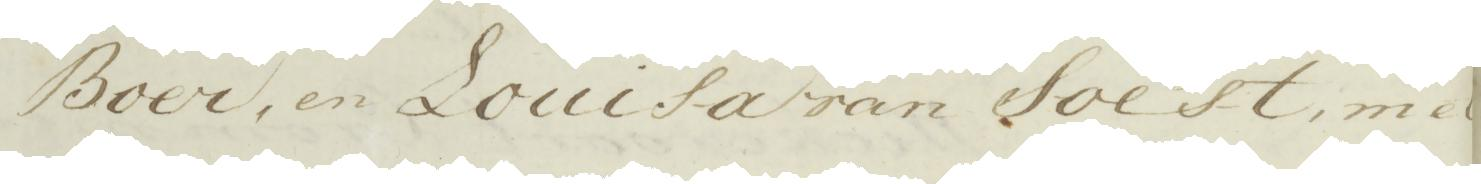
Boer, en Louisa van Soest, me
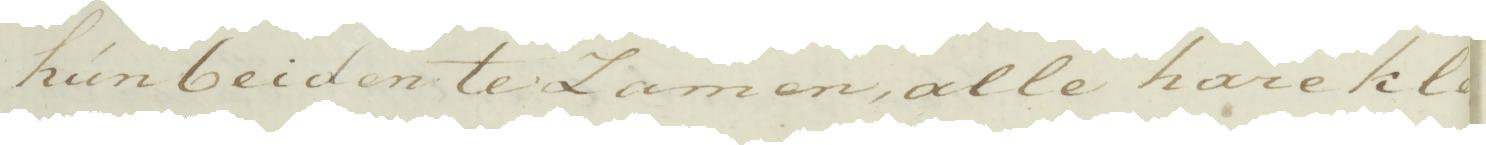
hun beiden te Zamen, alle hare kle
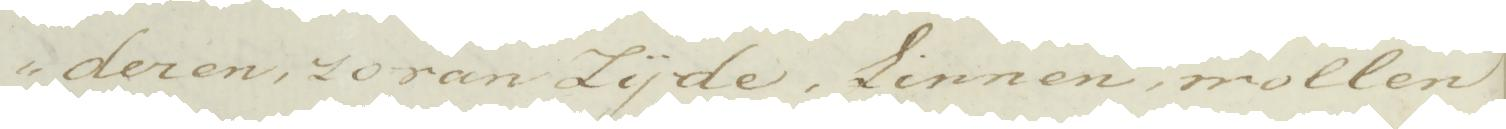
„deren, zo van Zijde, Linnen, wollen
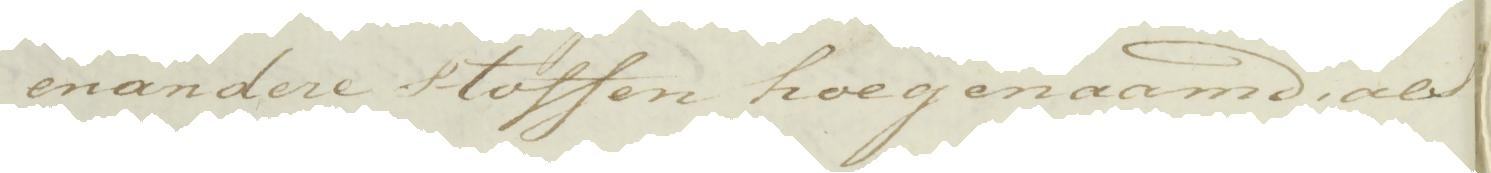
en andere stoffen hoegenaamd, als
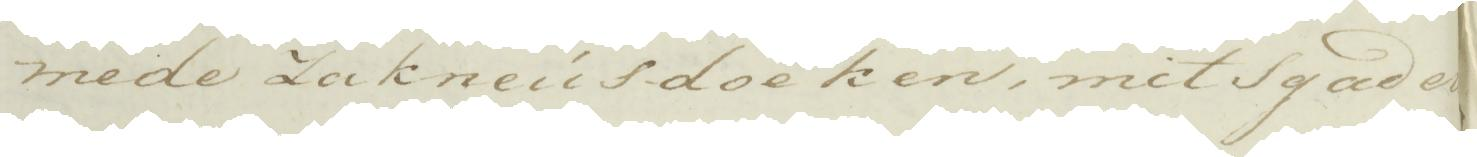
mede Zakneusdoeken, mitsgade
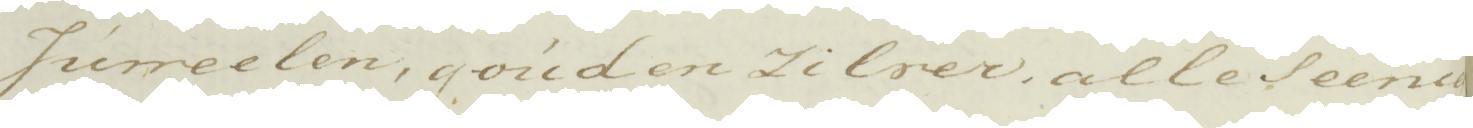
Juweelen, goud en zilver, alles eenig
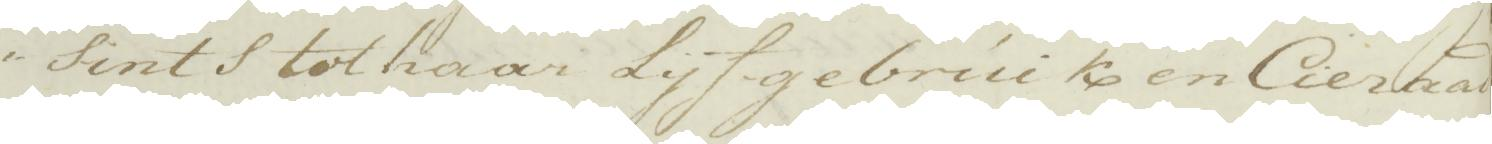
„sints tot haar Lijfgebruik en Cieraa
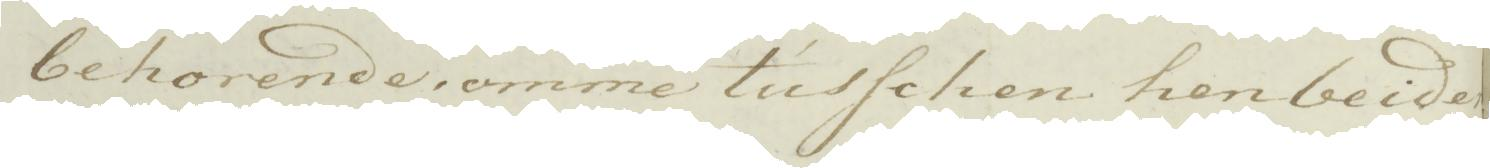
behorende, omme tusschen hen beide
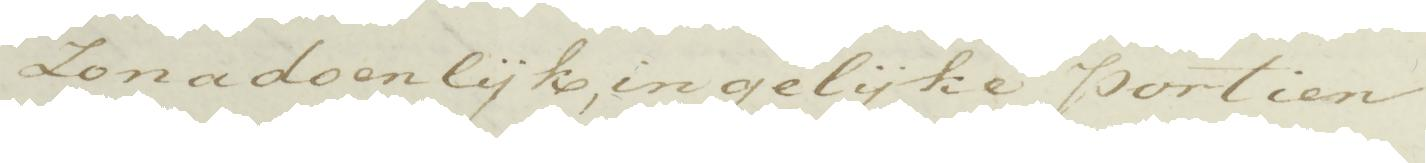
zonadoenlijk, in gelijke portien
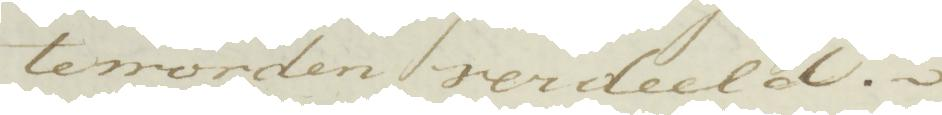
te worden verdeeld.-
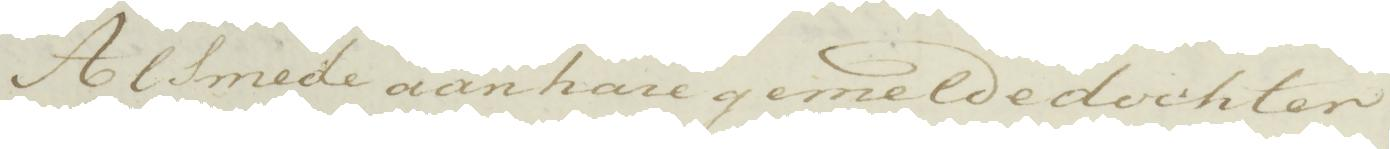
Alsmede aan hare gemelde dochter
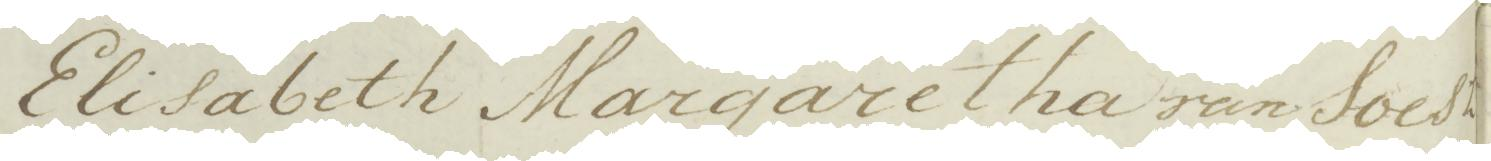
Elisabeth Margaretha van Soest
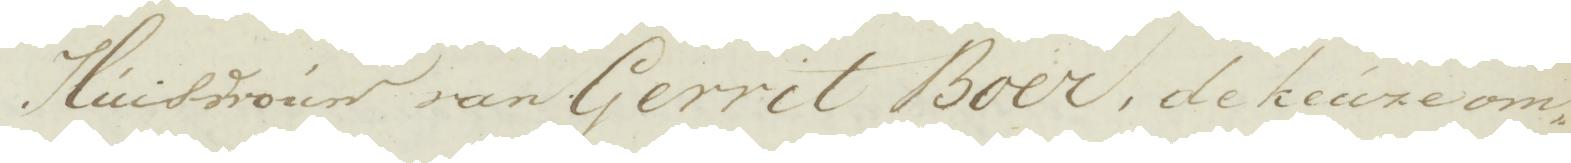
Huisvrouw van Gerrit Boer, de keuze om„
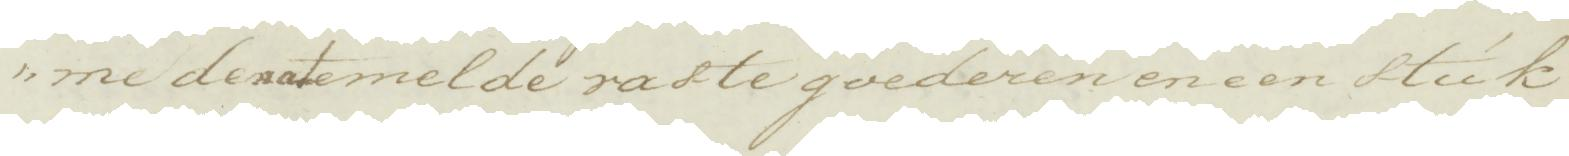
„me de natemelde vaste goederen en een stuk
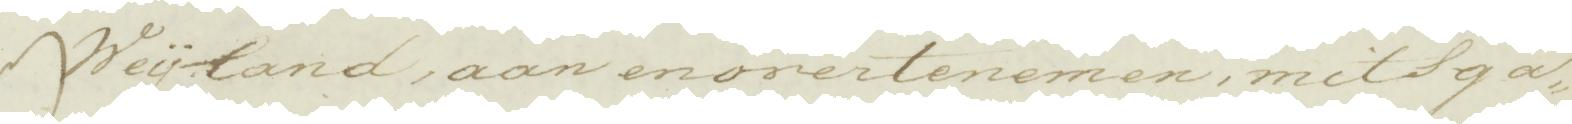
Weijland, aan en overtenemen, mitsga„
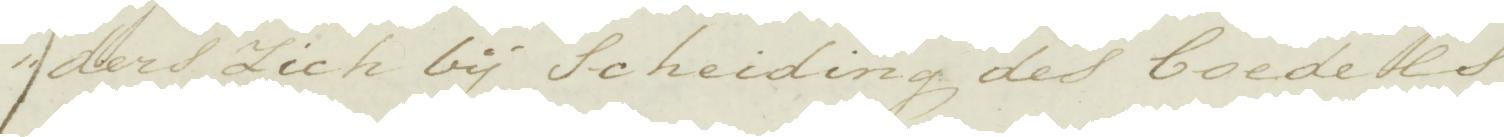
„ders zich bij scheiding, des boedels
